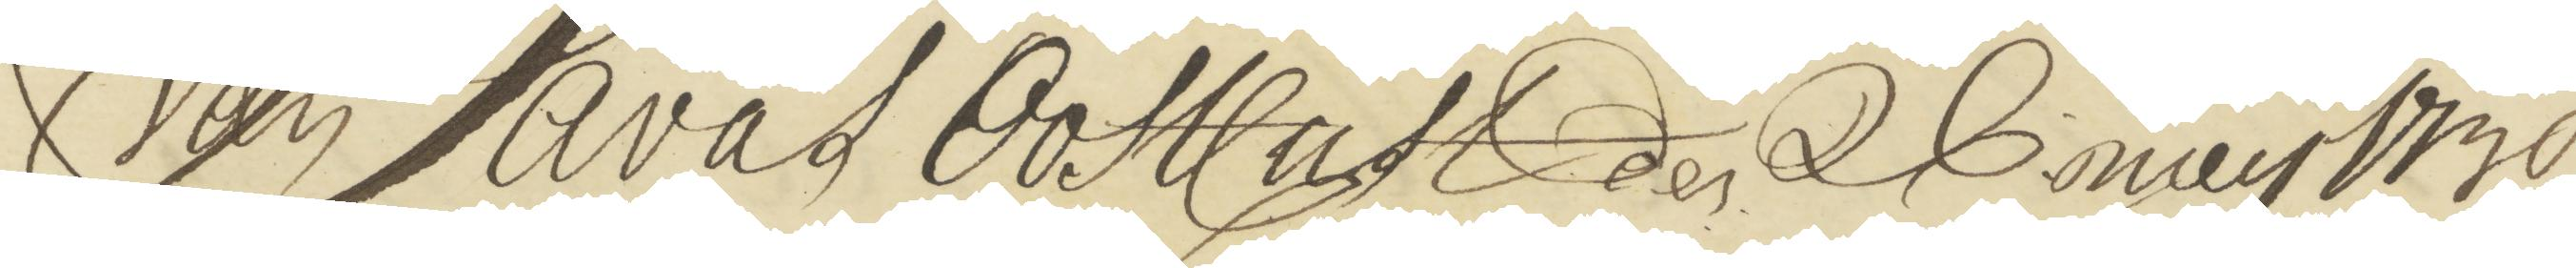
Van Javas Oostcust den 26: meij 1734
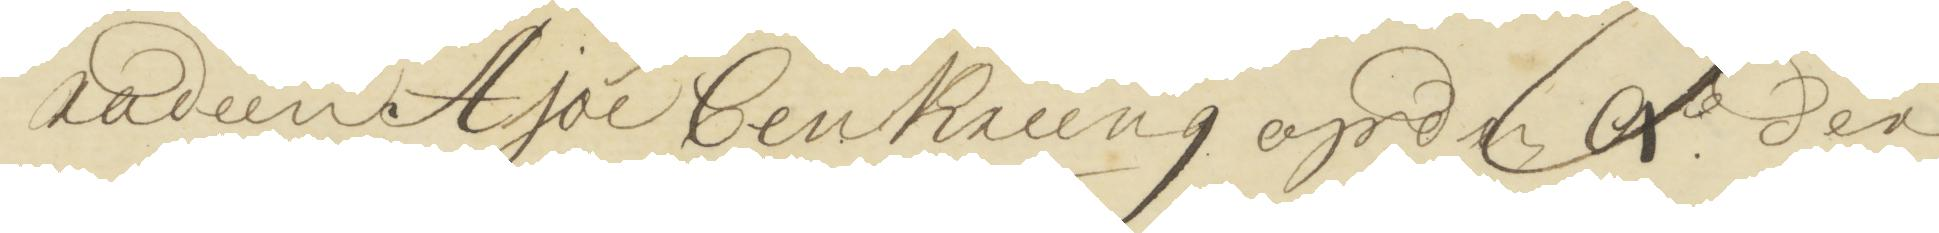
radeen Ajoe benkreeng op den 4: der
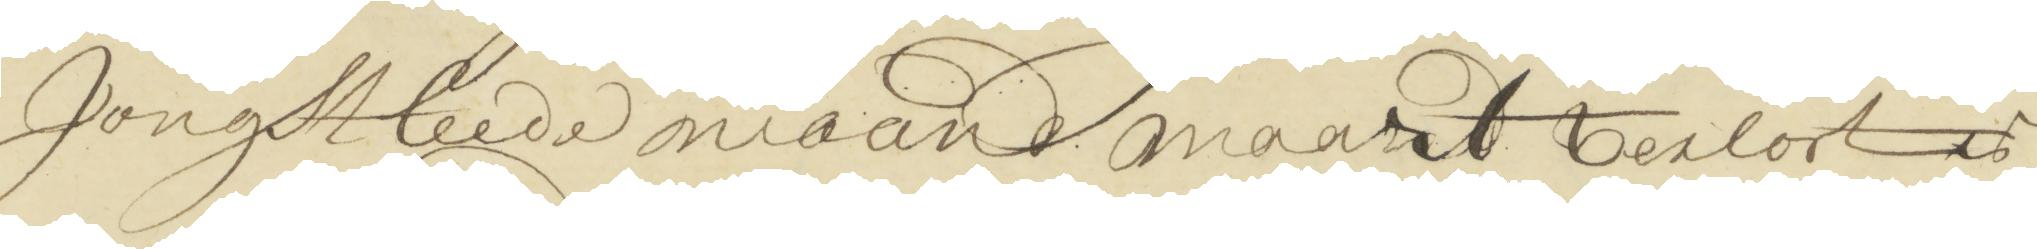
Jongstleede maand maart verlost is
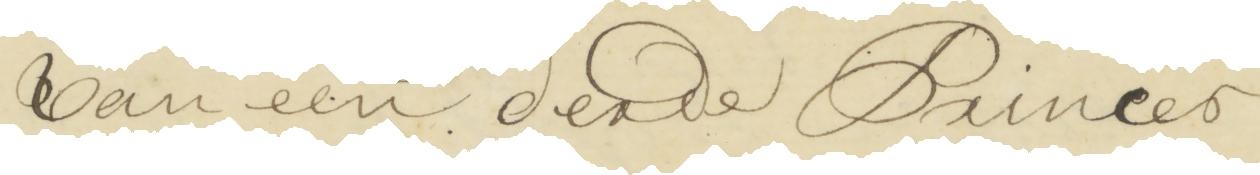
van een derde Princes
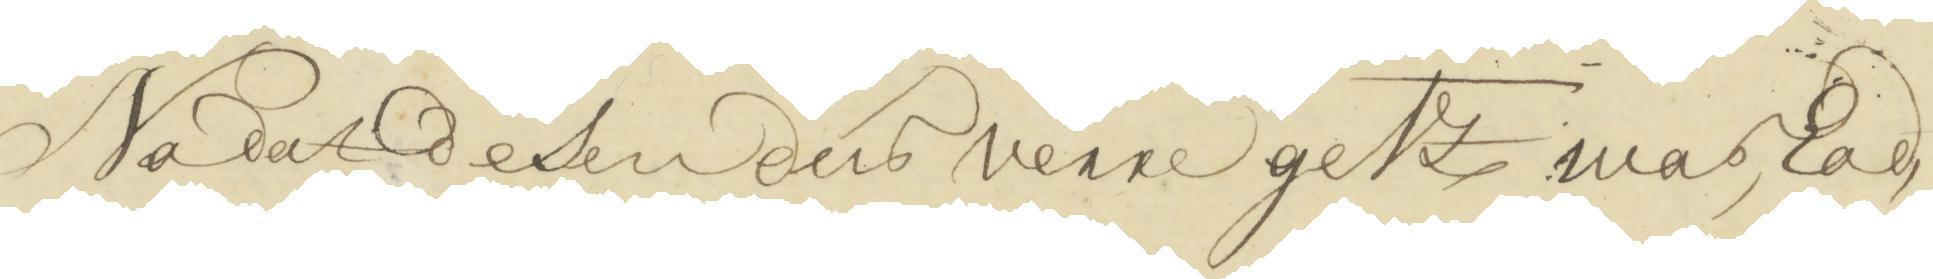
Na dat desen dus verre gesz was, had,
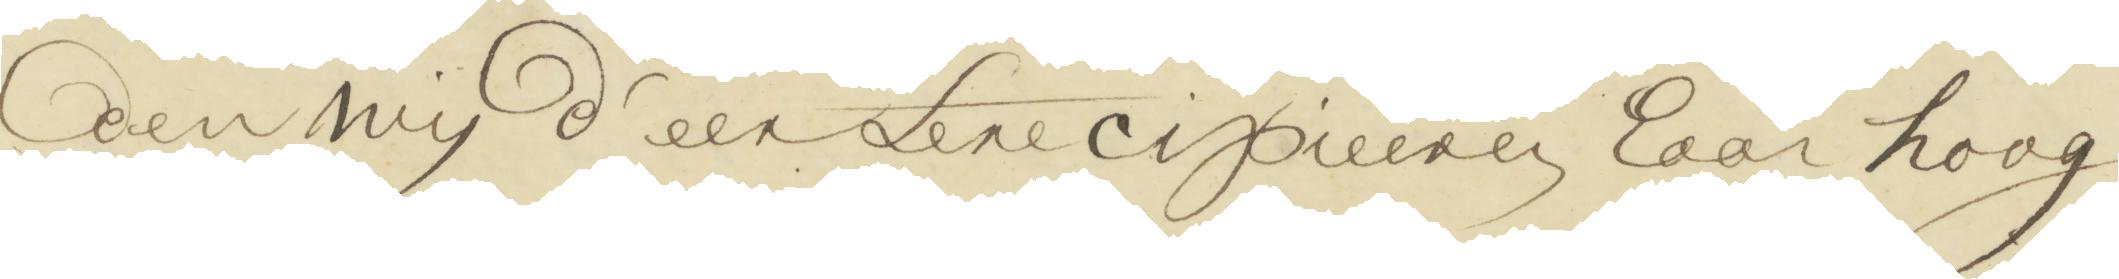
den wij d’ eer terecipieeren haar hoog
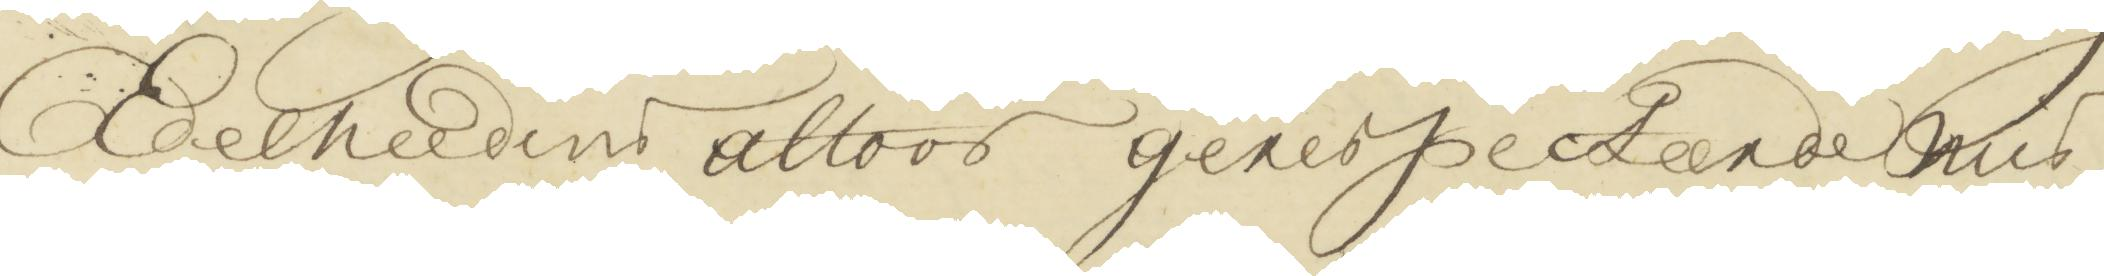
Edelheedens altoos gerespecteerde mis
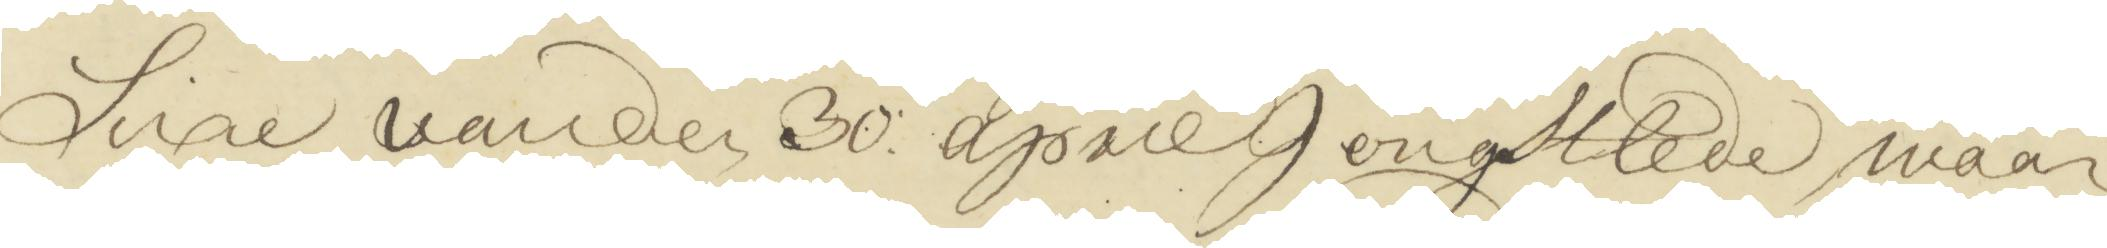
sive vanden 30: april Jongstlede waar
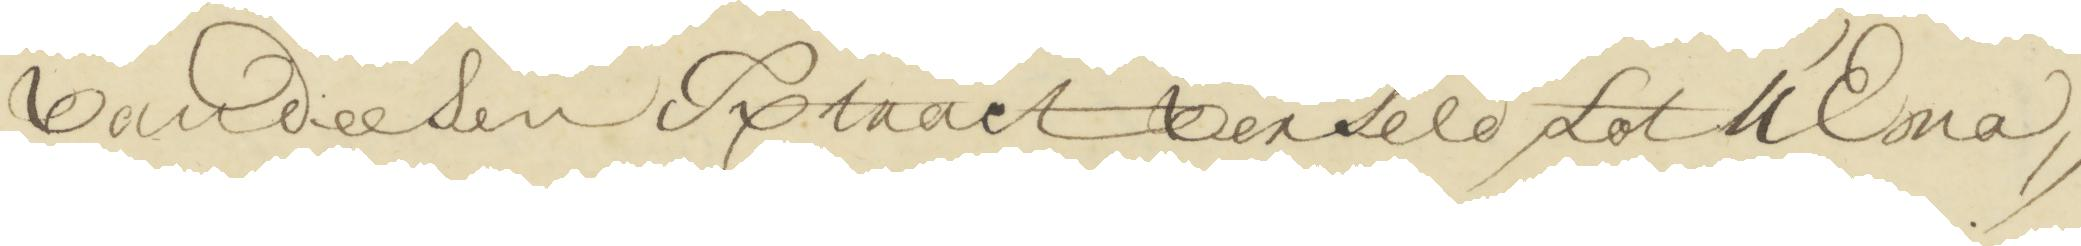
van deesen extract verseld tot uE na„
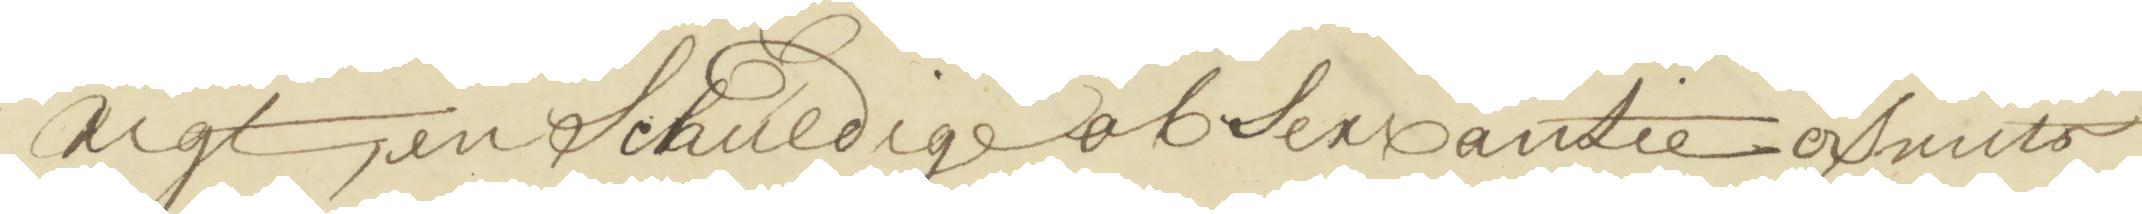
rigt, en schuldige observantie overmits
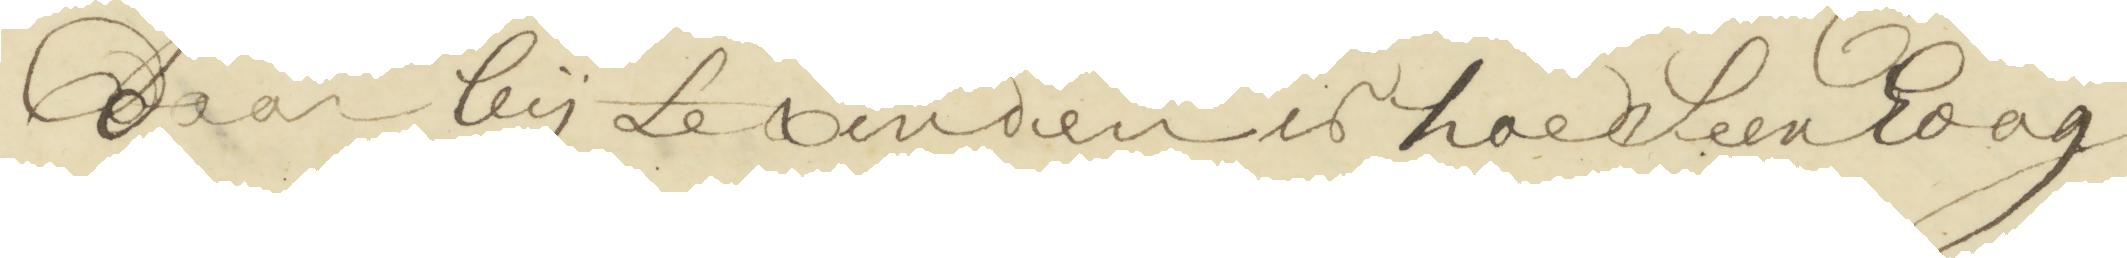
daar bij te vinden is hoe seer hoog
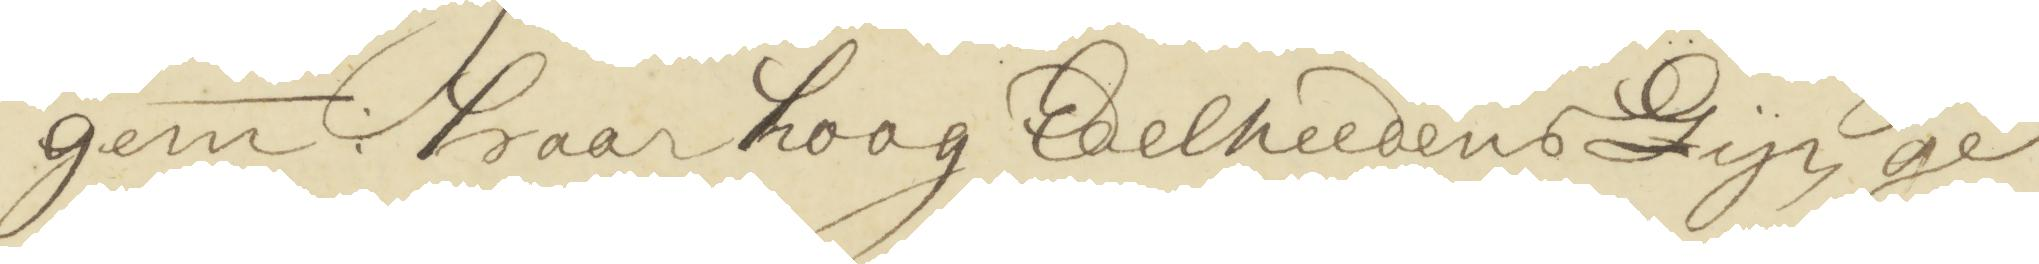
gem: haar hoog Edelheedens zijn ge
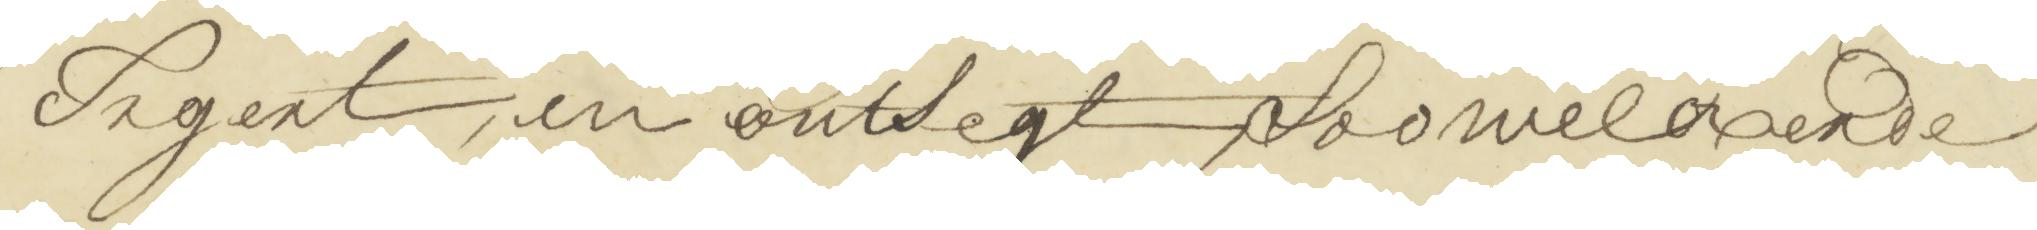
ergert, en ontsegt soo wel overde
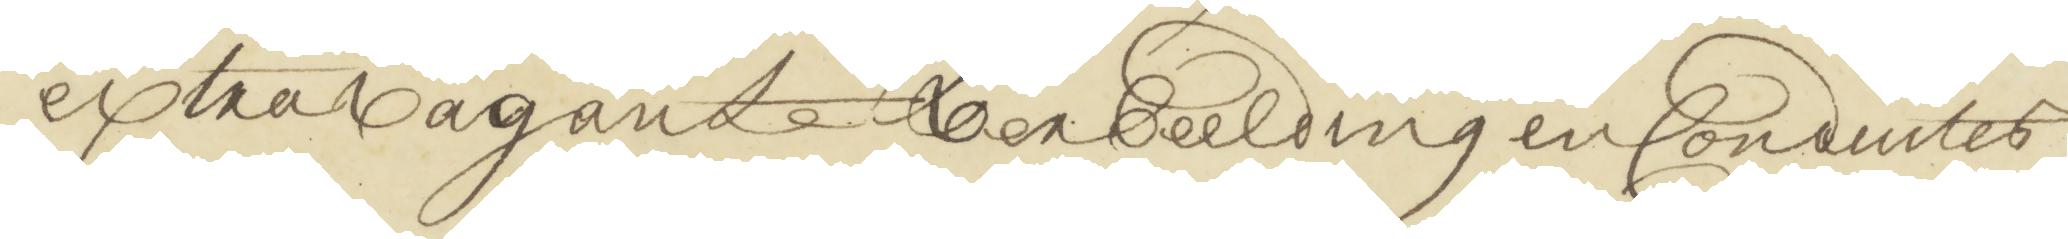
extravagante verbeelding en conduites
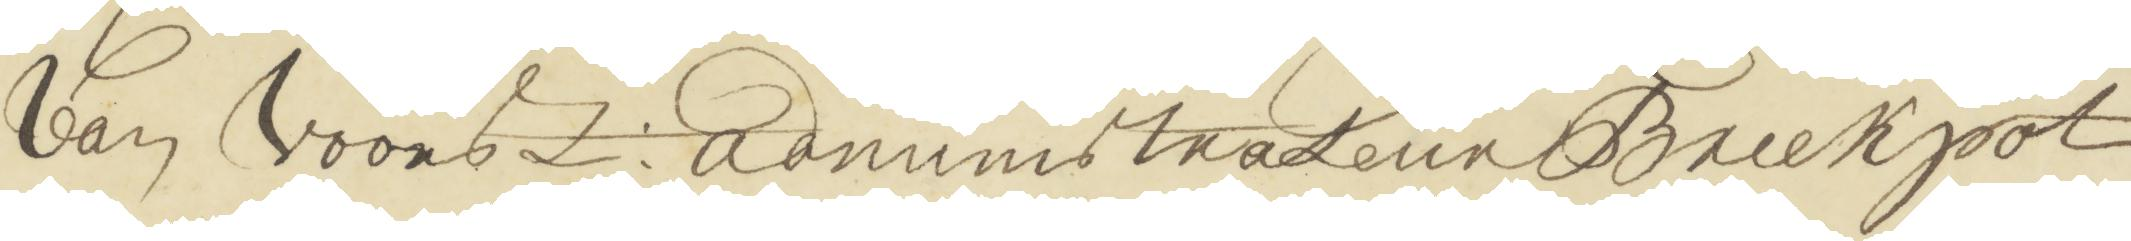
van voorsz: administrateur Breekpot
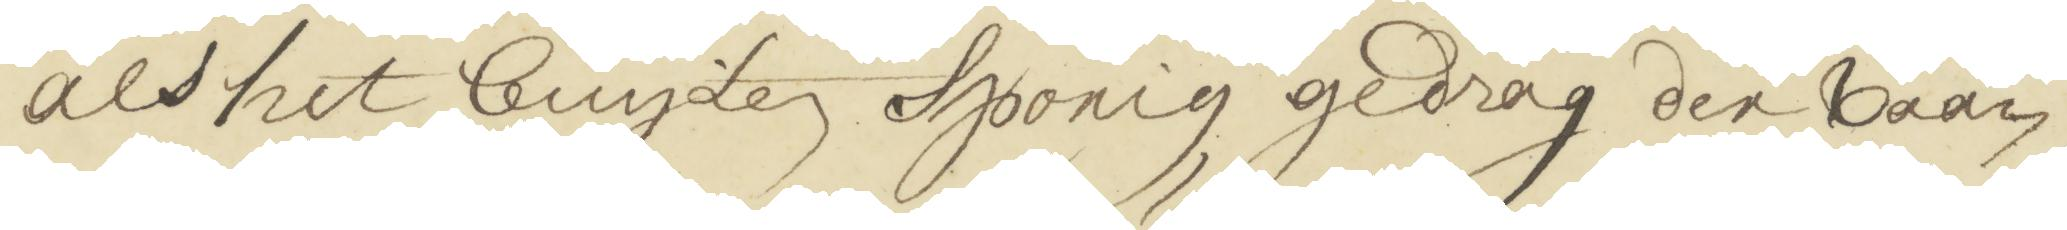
als het buijten sporig gedrag der vaan
